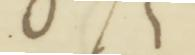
875
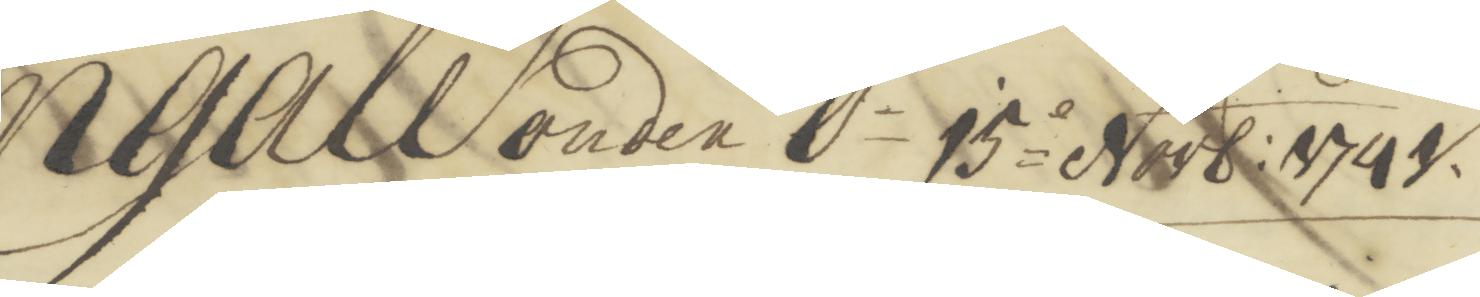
Van Bengale onder d=o 15=e Novb: 1741.
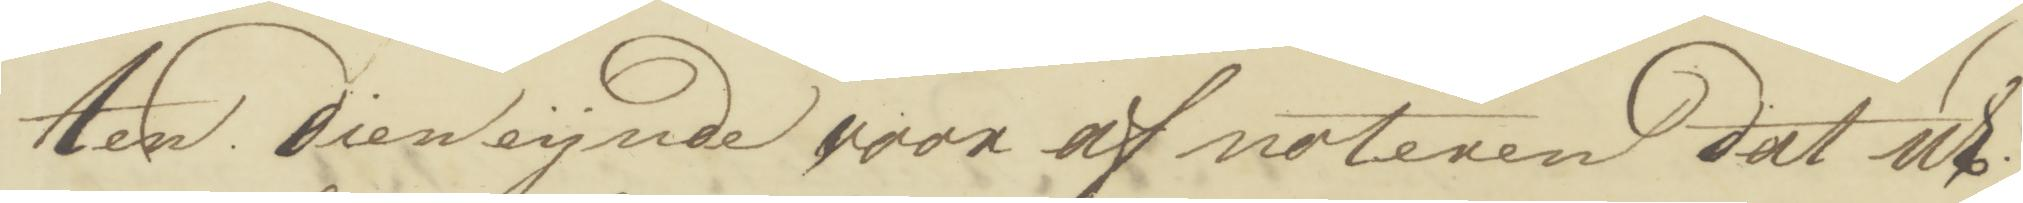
ten dien eijnde voor af noteren dat uE:
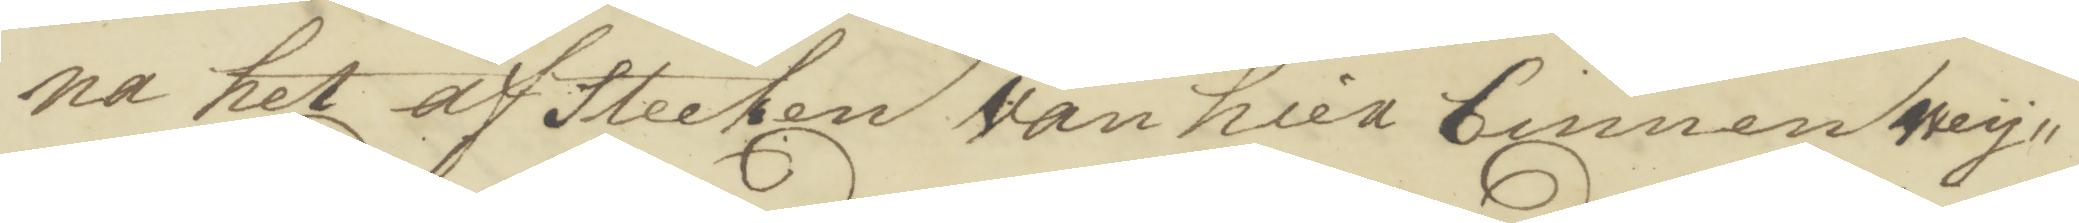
na het afsteeken van hier binnen weij„
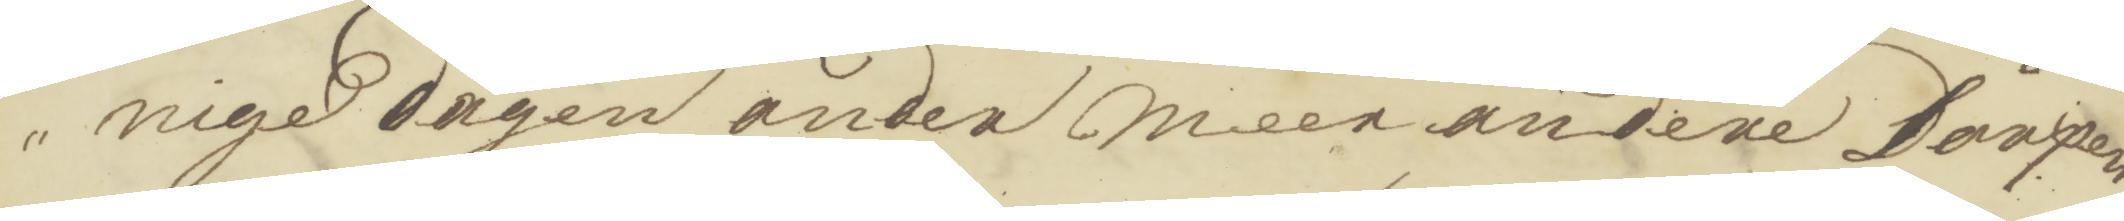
„nige dagen onder meer andere Dorpen
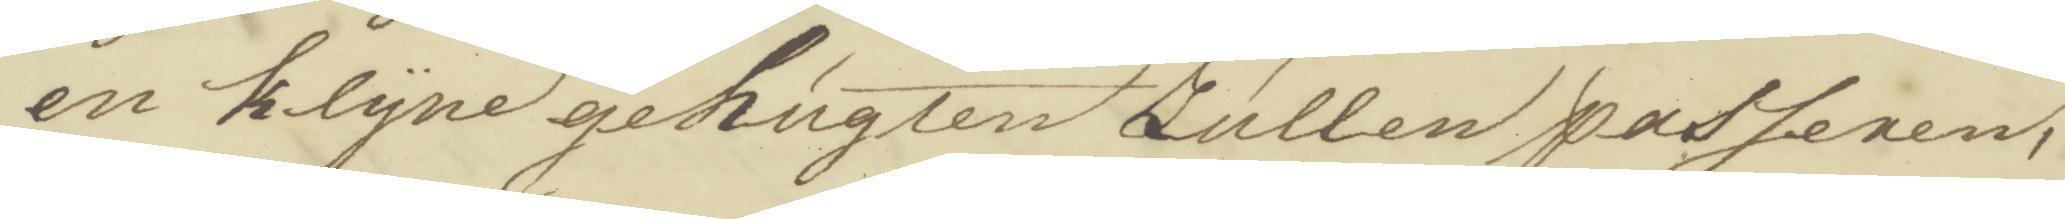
en klijne gehugten zullen passeren,
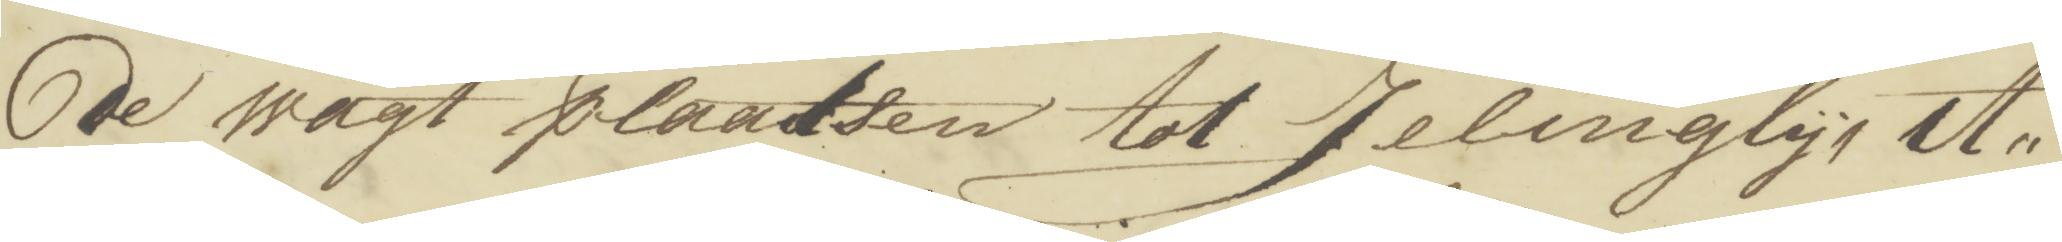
de wagt plaatsen tot Jelinglij„ A„
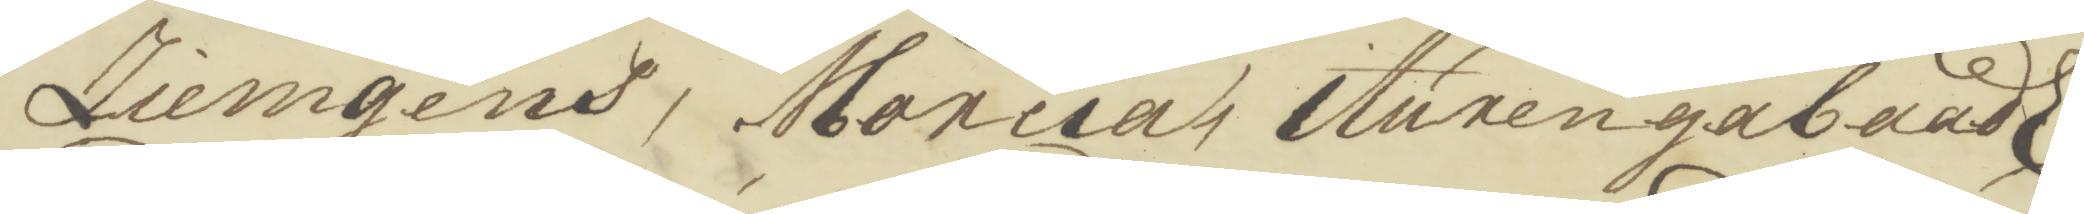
Ziemgens, Morcia, Aurengabaadh,
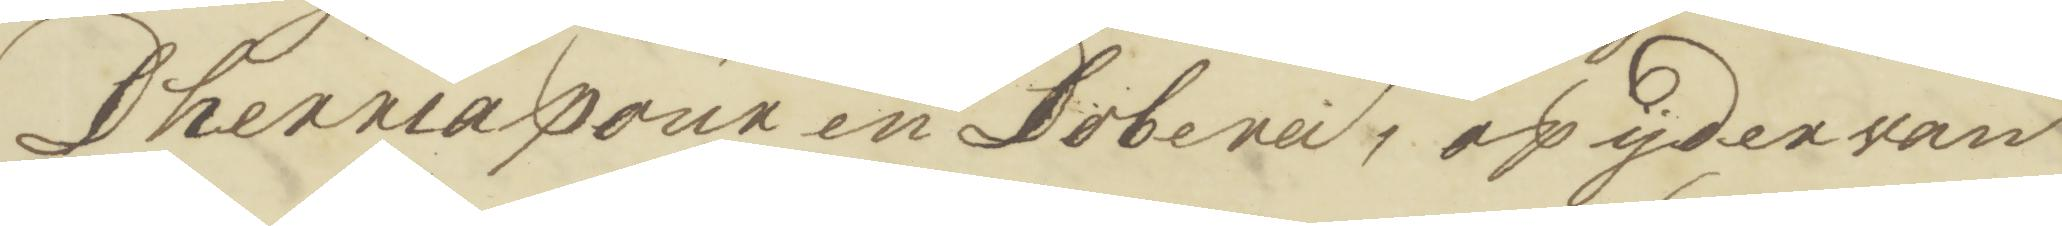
Dherriapour en Dobera, op ijder van
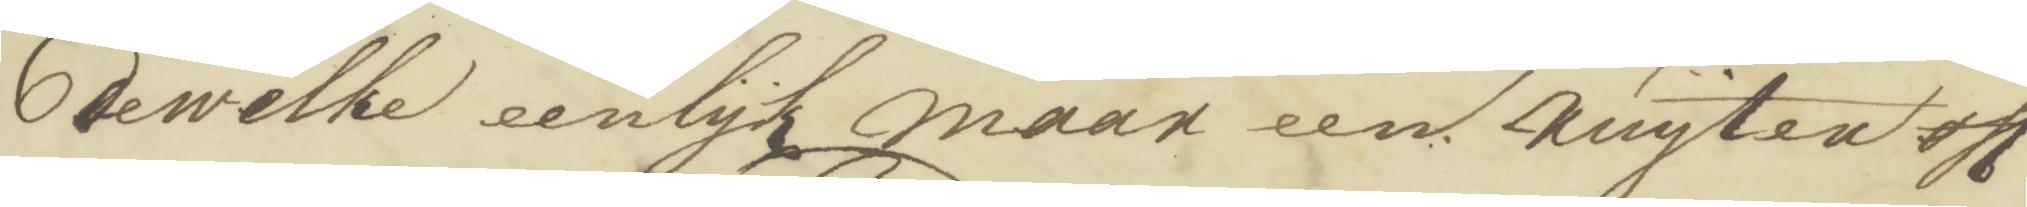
dewelke eenlijk maar een ruijter off
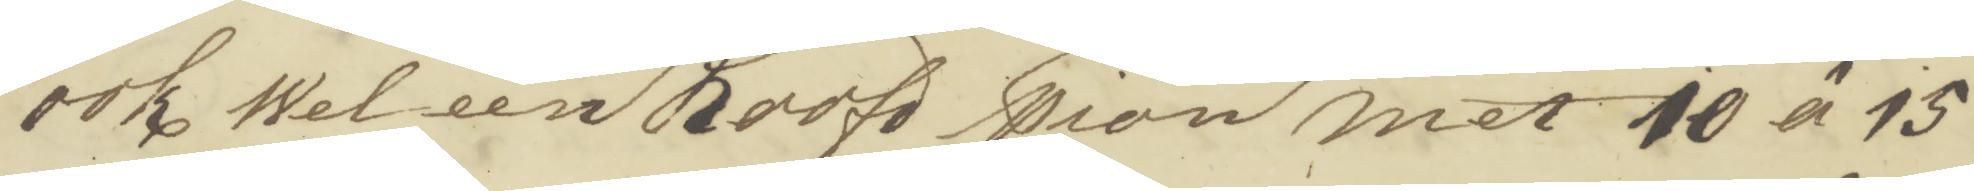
ook wel een hoofd pion met 10 â 15
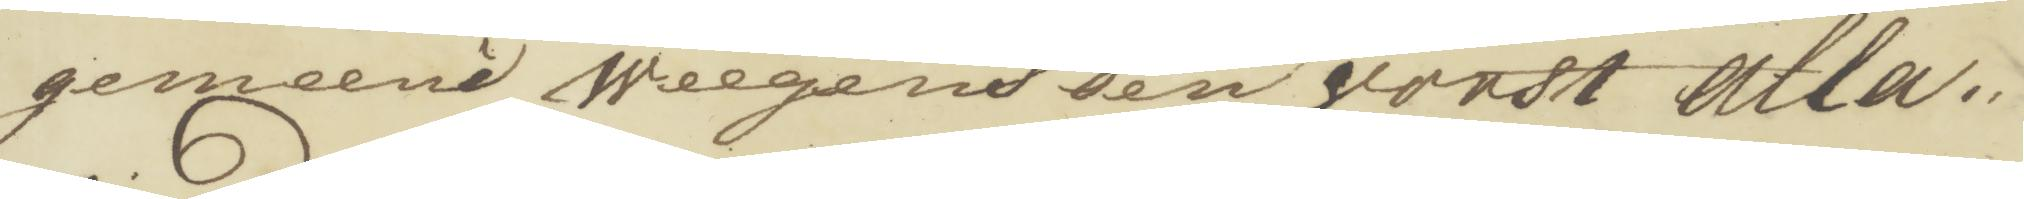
gemeene weegens den vorst alla„
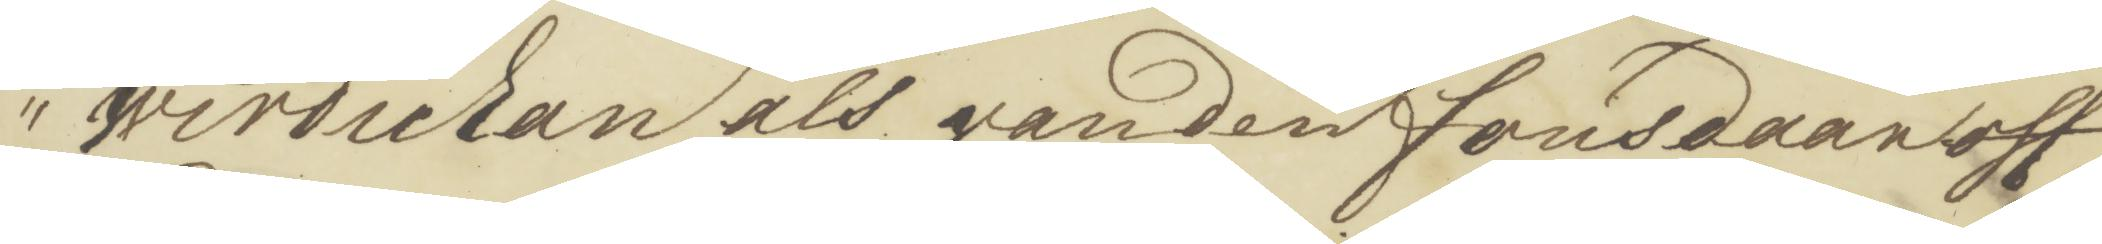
„werdichan als van den fous daar off
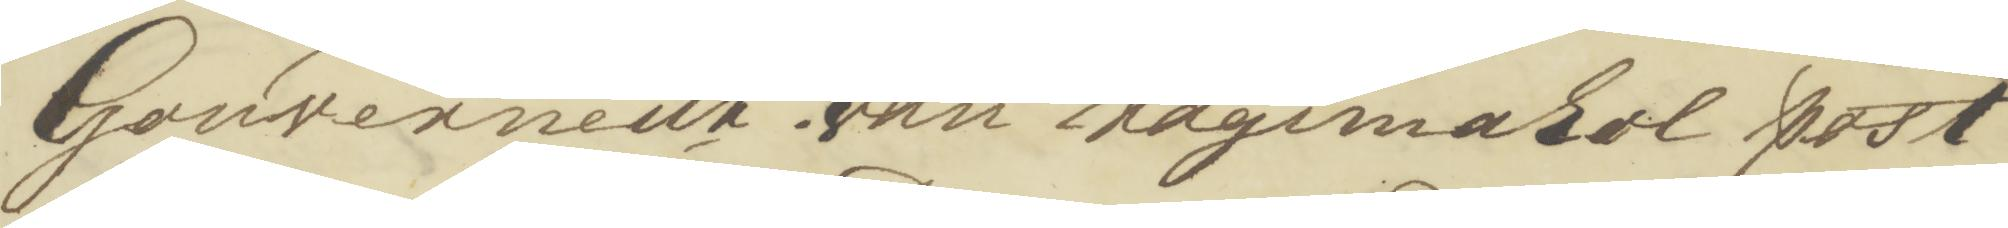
Gouverneur van ragimahol post
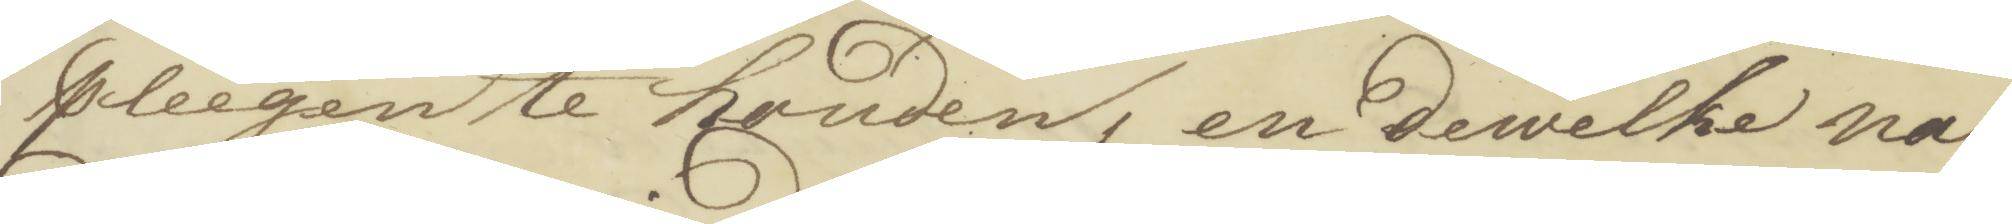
pleegen te houden, en dewelke na
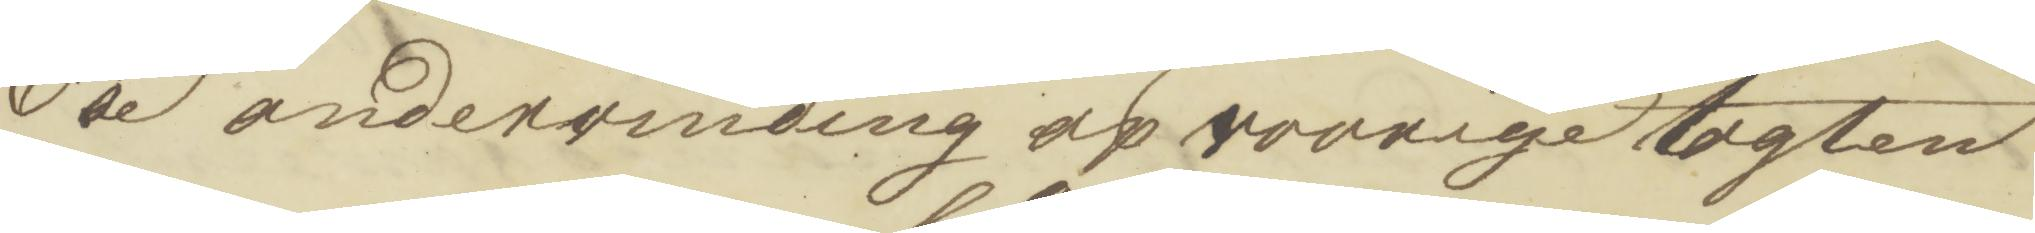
de ondervinding op voorige togten
